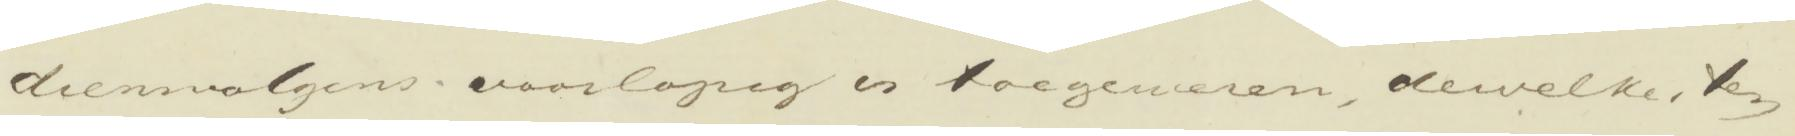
diensvolgens voorlopig is toegewezen, dewelke, ten
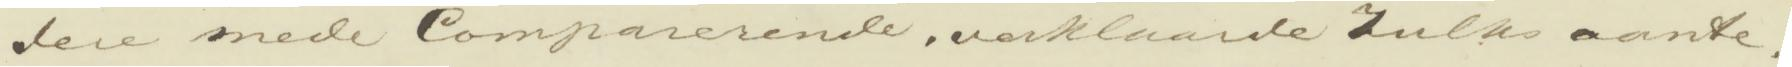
deze mede Comparerende, verklaarde zulks aante,
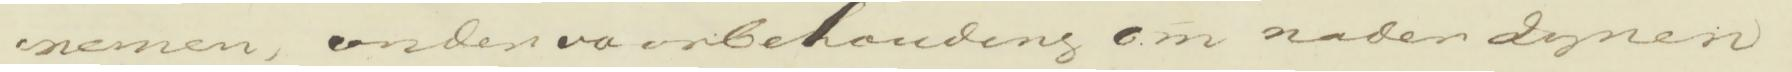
nemen, onder voorbehouding om nader zynen
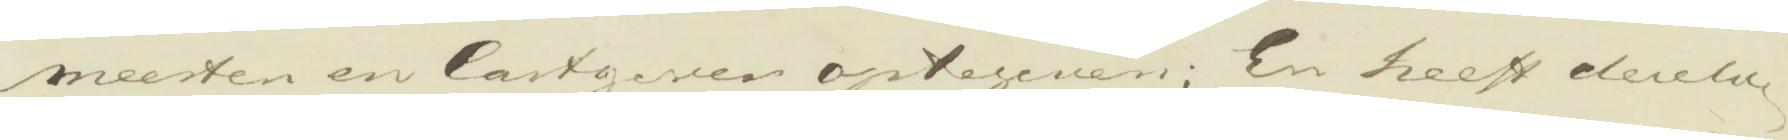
meester en lastgever optegeven; En heeft dezelve
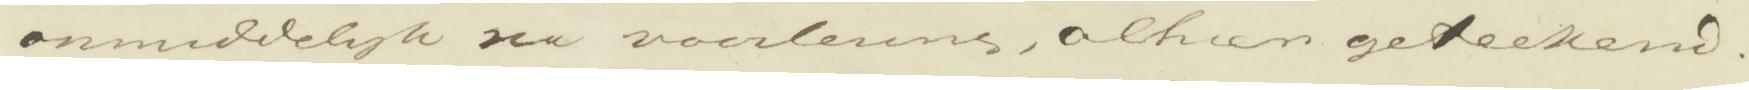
onmiddelijk na voorlezing, alhier geteekend.
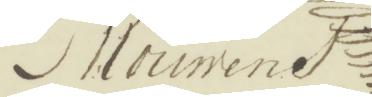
Mouwens
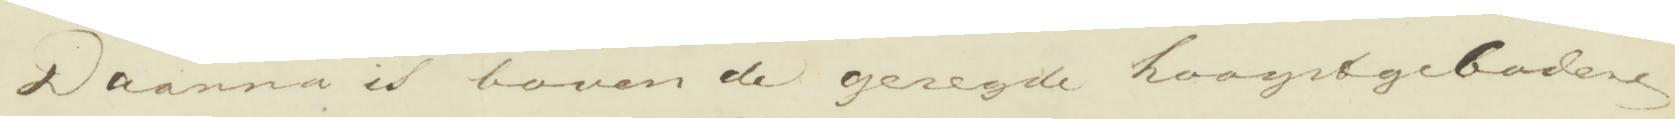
Daarna is boven de gezegde hoogstgebodene
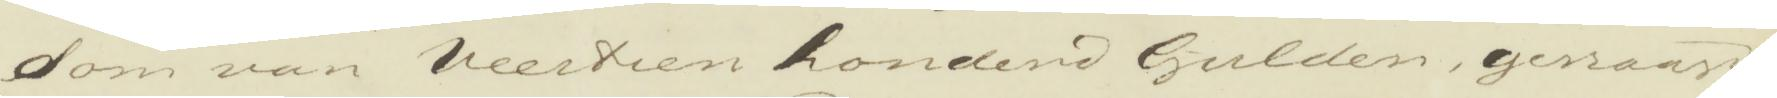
som van Veertien honderd Gulden, gevraagd
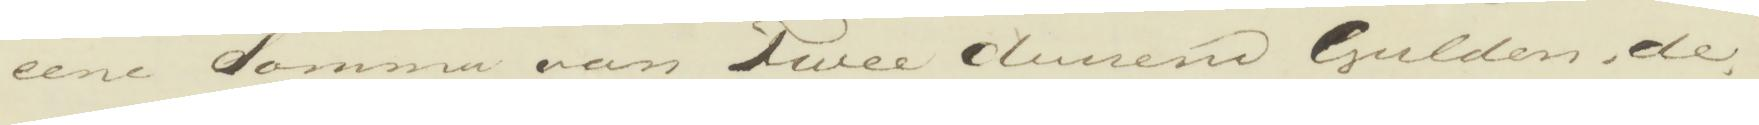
eene somma van Twee duizend Gulden, de„
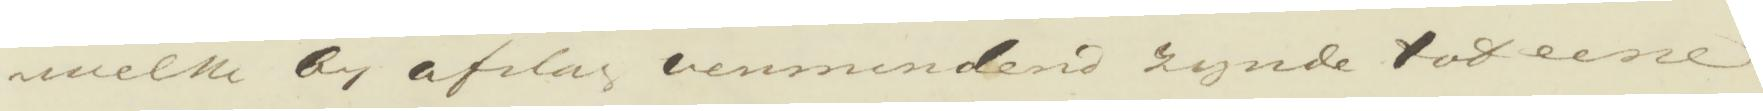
welke by afslag verminderd zynde tot eene
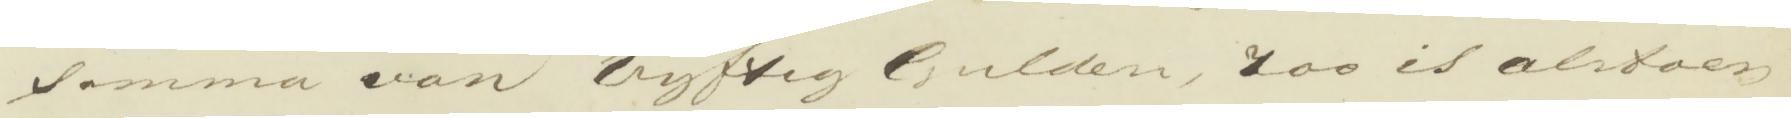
somma van Vyftig Gulden, zoo is alstoen
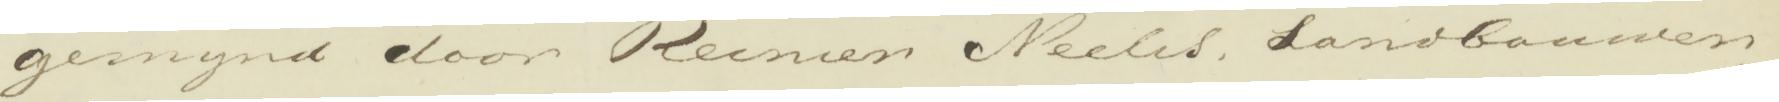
gemynd door Reinier Neelis, Landbouwer,
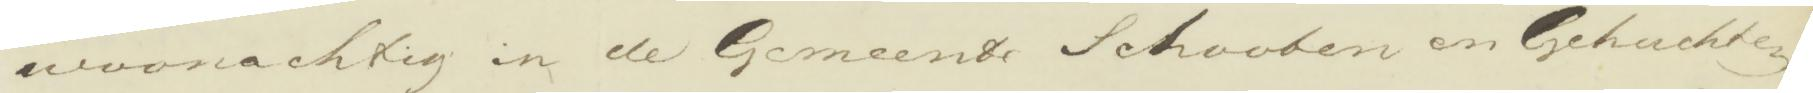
woonachtig in de Gemeente Schooten en Gehuchten
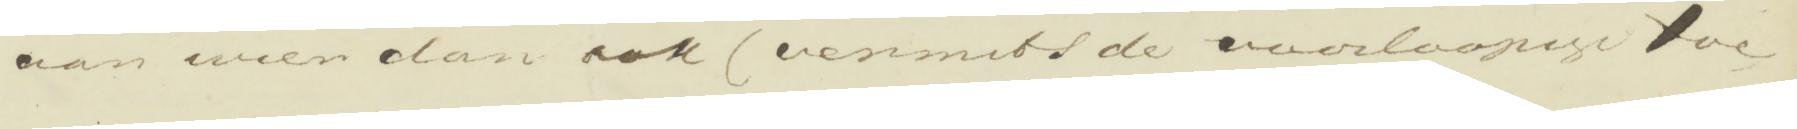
aan wier dan ook (vermits de voorloopige toe
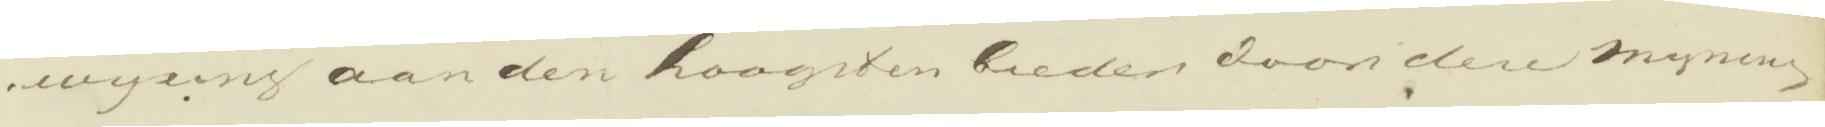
„wijzing aan den hoogsten bieder door deze myning
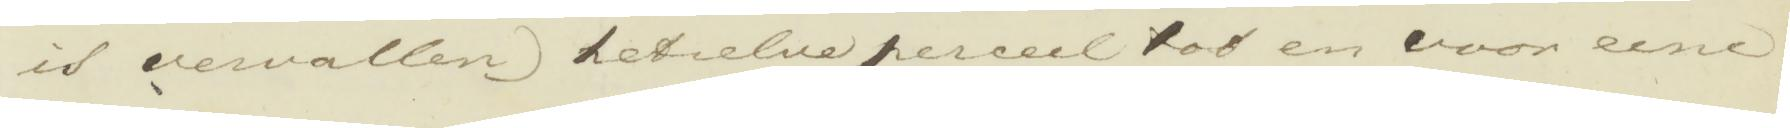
is vervallen) hetzelve perceel tot en voor eene
